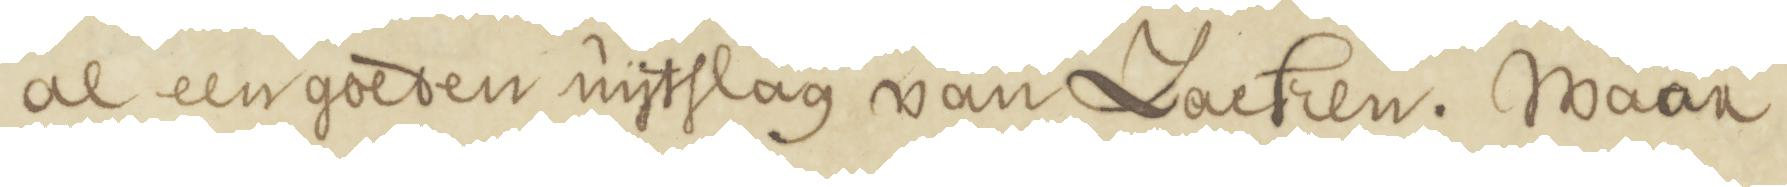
al een goeden uijtslag van zaeken. Waar
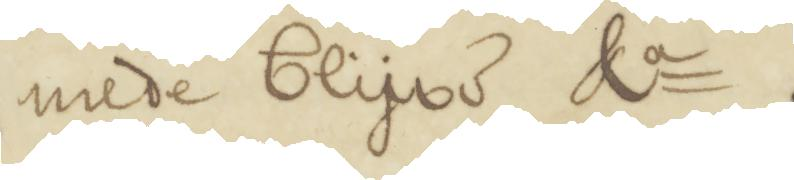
mede blijve &=a.
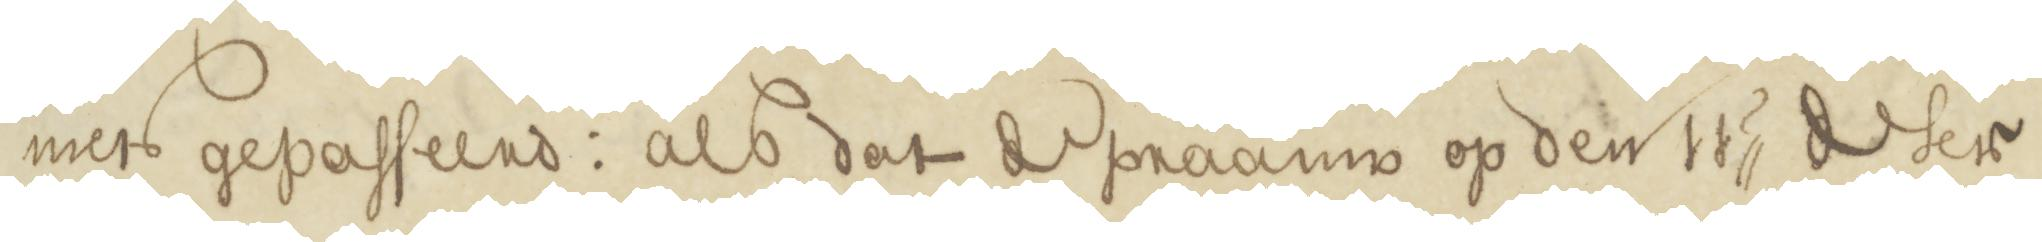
niets gepasseerd: als dat de praauw op den 11„' deser
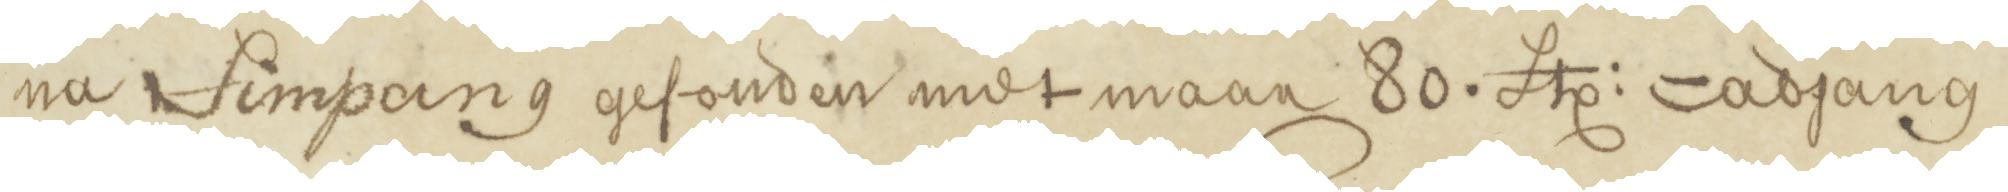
na Simpang gesonden met maar 80. stx: cadjang
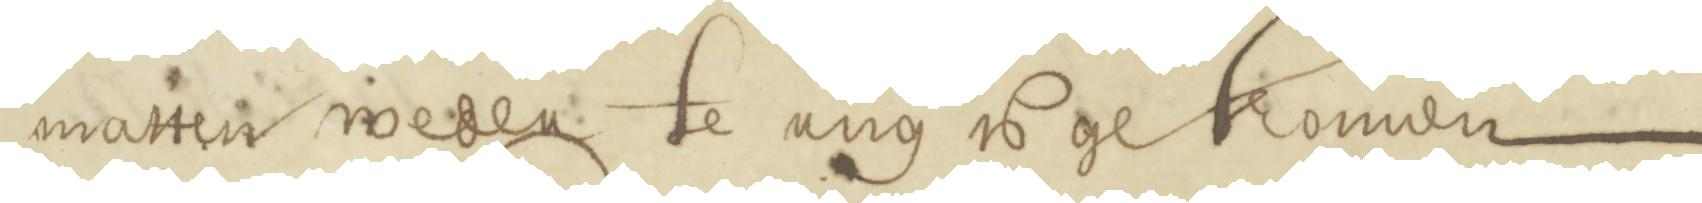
matten weder te rug is gekomen.
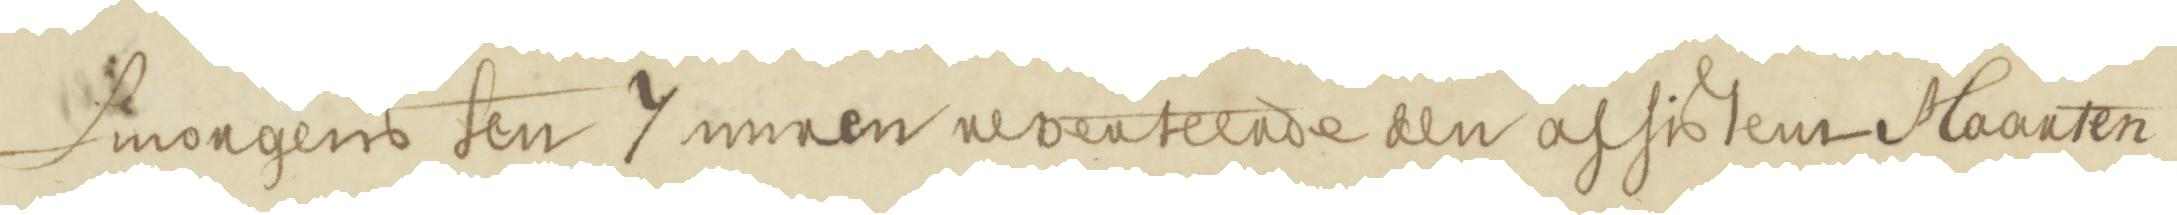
Smorgens ten 7 uuren reverteerde den assistent Maarten
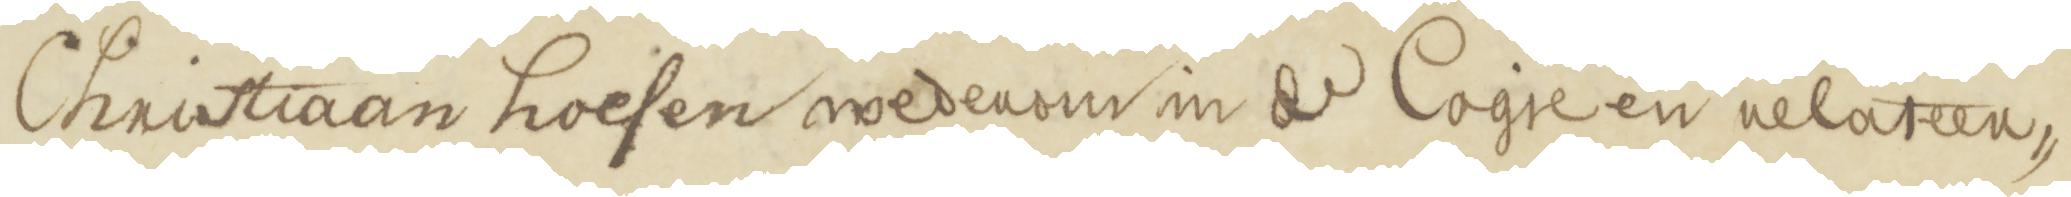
Christiaan hoesen wederom in de Logie en relateer„
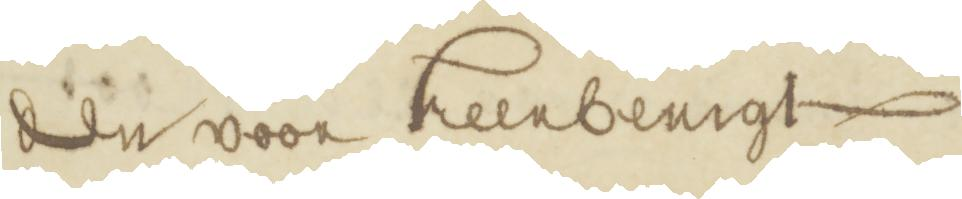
den voor keerberigt
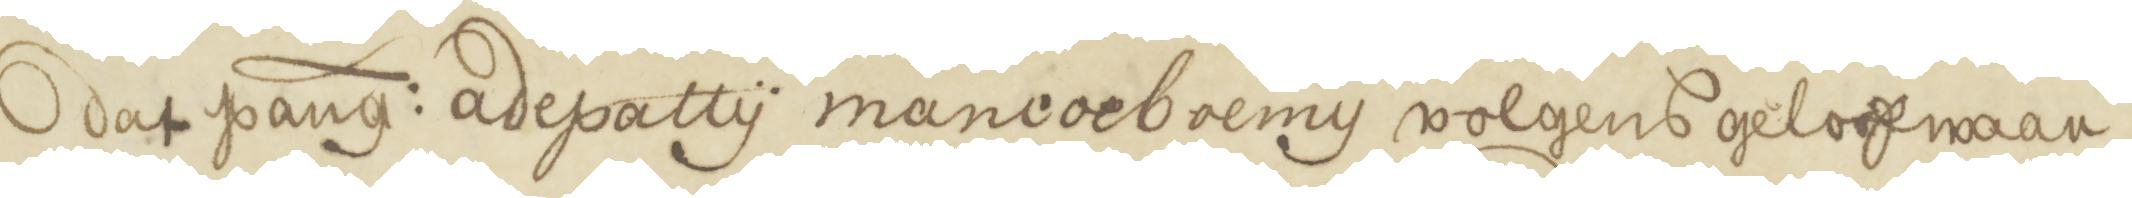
dat pang: adepattij mancoeboemij volgens geloofwaar
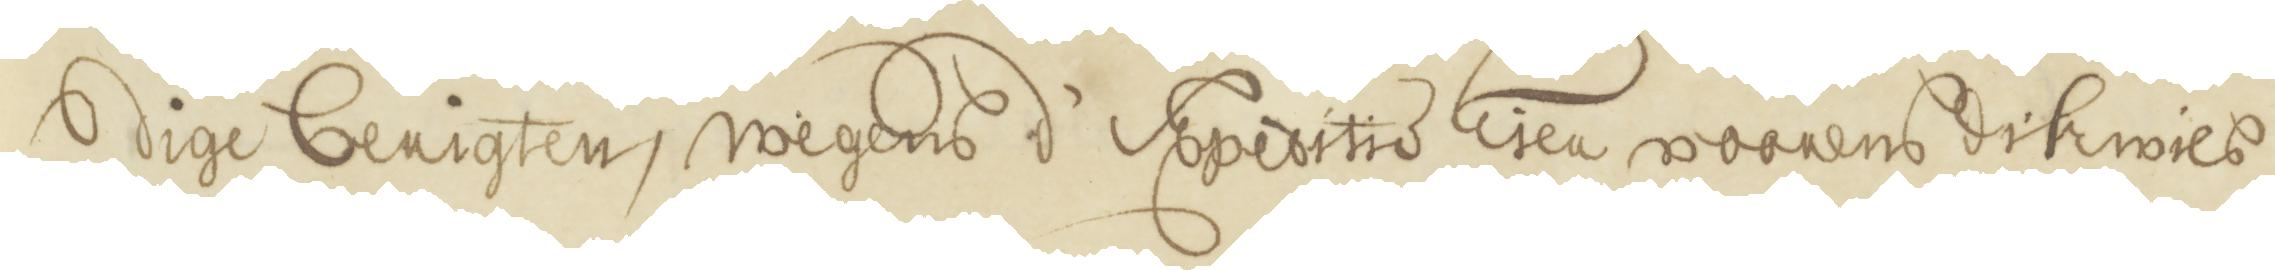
dige berigten, wegens d’ Expeditie hier voorens dikwils
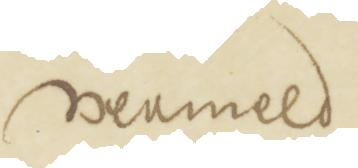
vermeld.
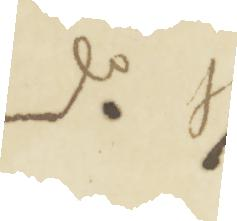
_.o 17„'
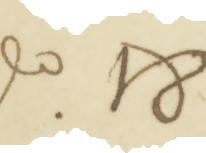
_.o 18
